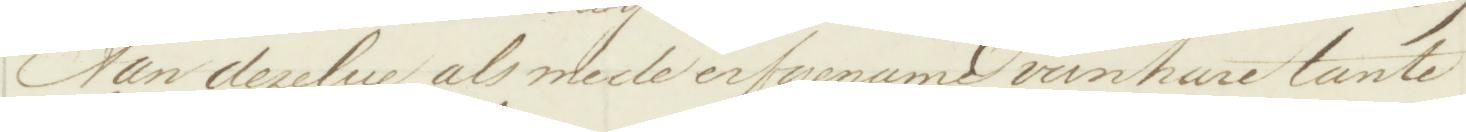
Aan dezelve als mede erfgename van hare tante
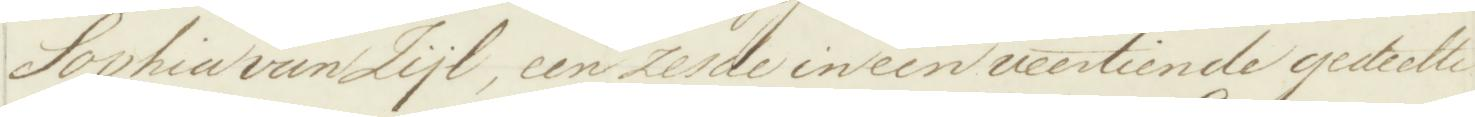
Sophia van Zijl, een zesde in een veertiende gedeelte
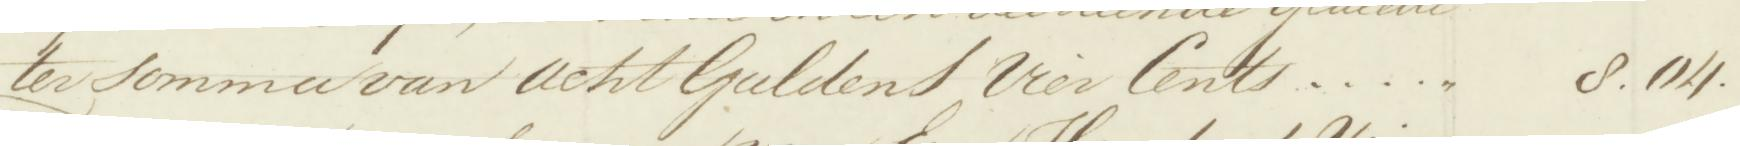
ter somma van acht Guldens vier Cents . . . . „ 8. 04.
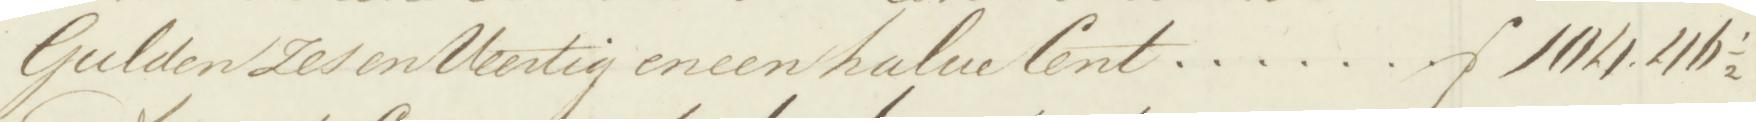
Gulden zes en Veertig en een halve Cent . . . . . . . ƒ 104.46½
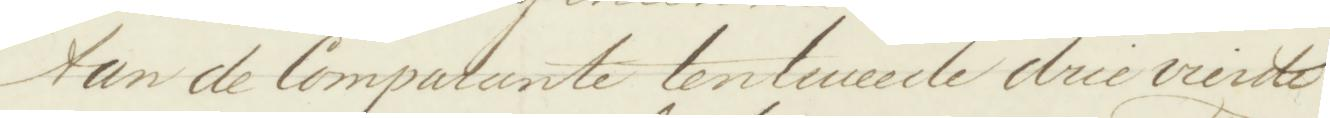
Aan de Comparante ten tweede drie vierde
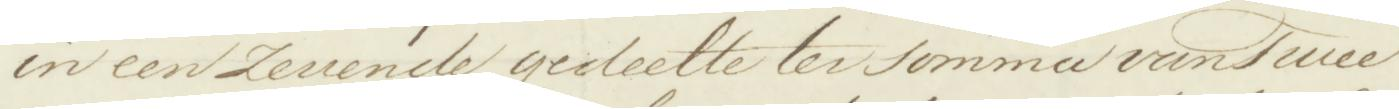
in een zevende gedeelte ter somma van Twee
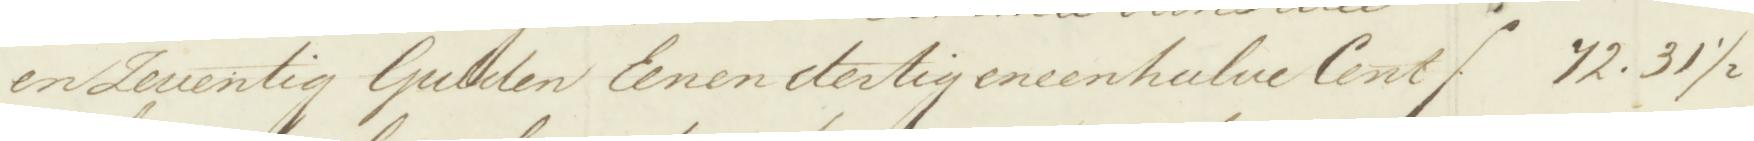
en Zeventig Gulden Eenen dertig en een halve Cent ƒ 72.31½
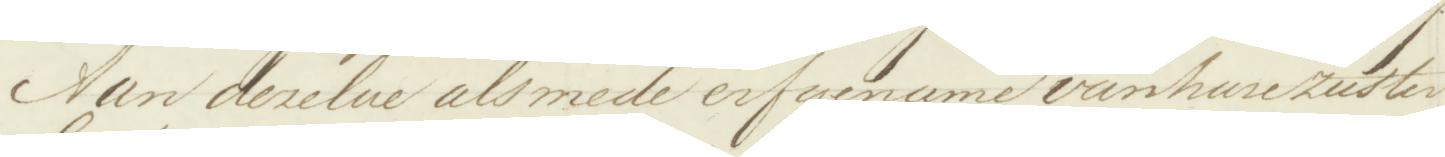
Aan dezelve als mede erfgename van hare zuster
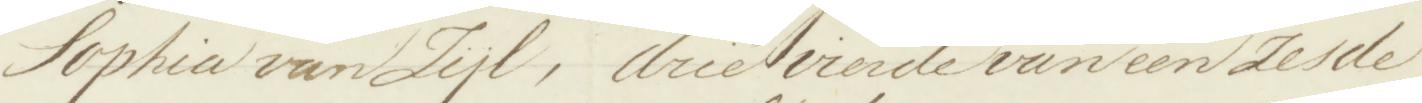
Sophia van Zijl, drie vierde van een zesde
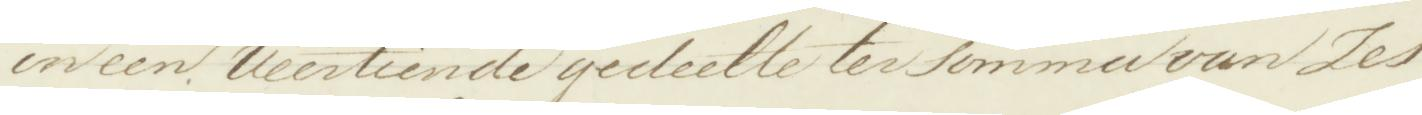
in een veertiende gedeelte ter somma van Zes
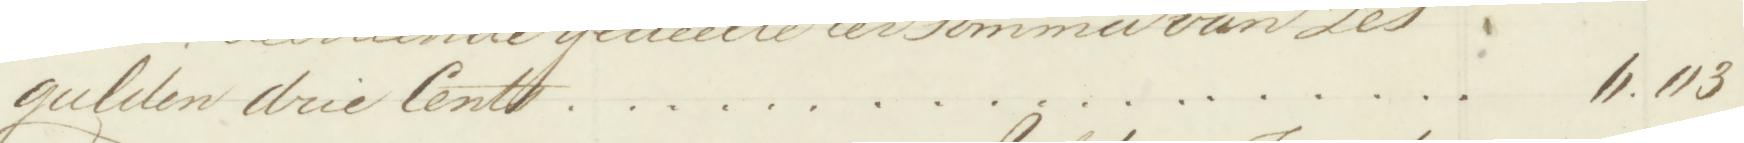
gulden drie Cents . . . . . . . . . . . . . . . . . . . . 6. 03
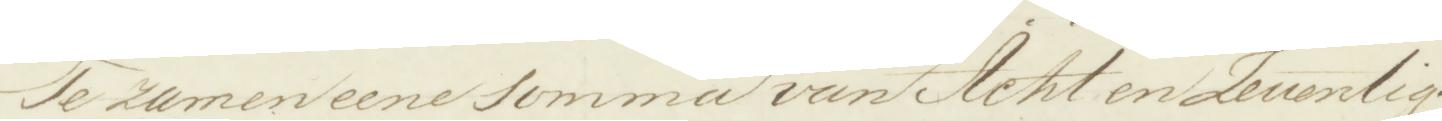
Te zamen eene somma van Acht en Zeventig
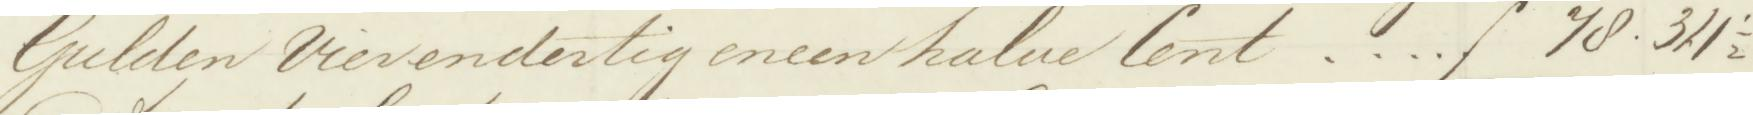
Gulden Vier endertig en een halve Cent . . . . ƒ 78. 34½
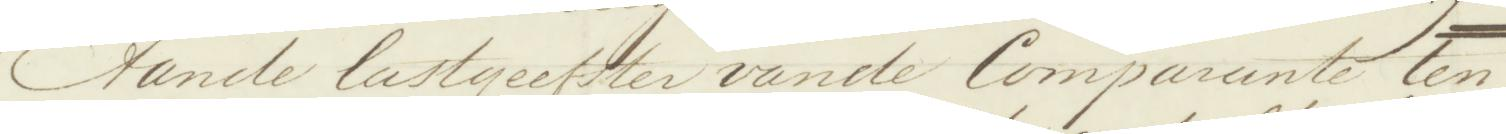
Aan de lastgeefster van de Comparante ten
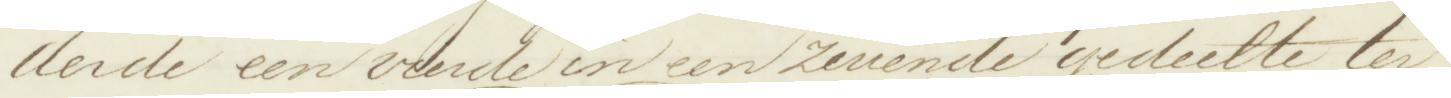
derde een vierde en een zevende gedeelte ter
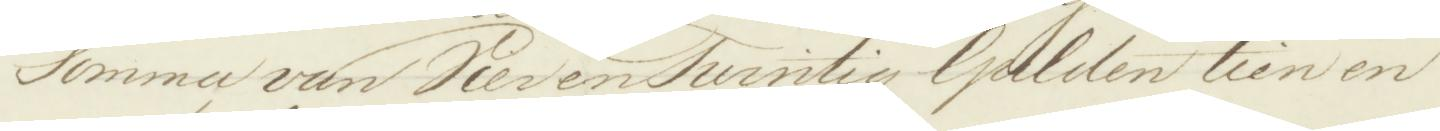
somma van Vier en Twintig Gulden tien en
